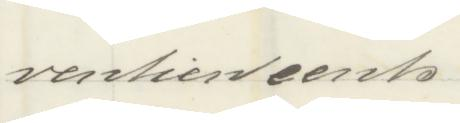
ventien cents
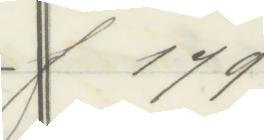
ƒ 179
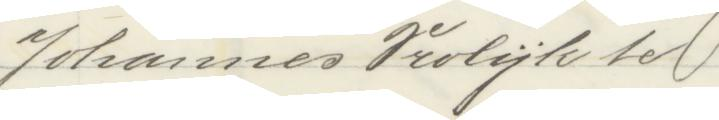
Johannes Vrolijk te
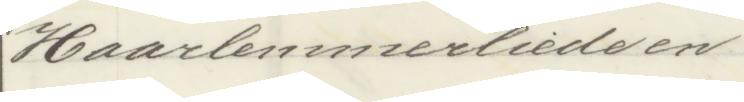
Haarlemmerliede en
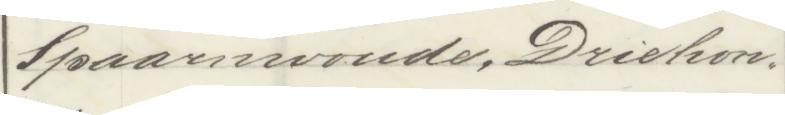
Spaarnwoude, Driehon„
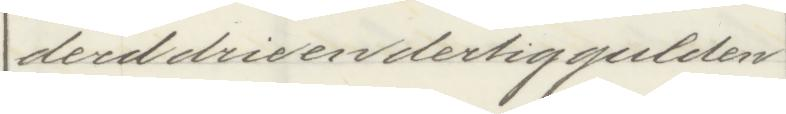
derd drie en dertig gulden
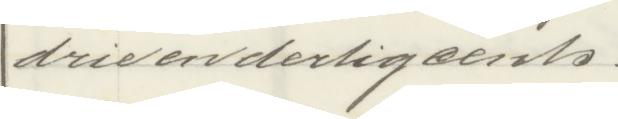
drie en dertig cents.
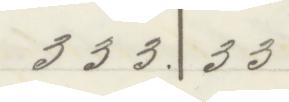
333. 33
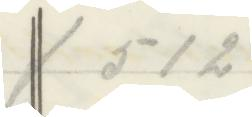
ƒ 512
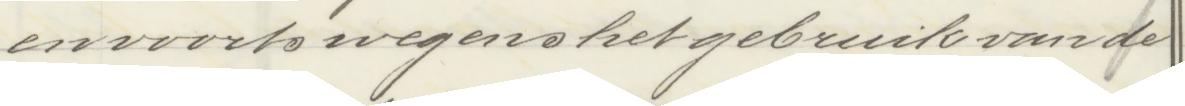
en voorts wegens het gebruik van de
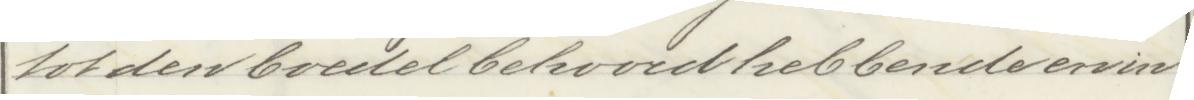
tot den boedel behoord hebbende en in
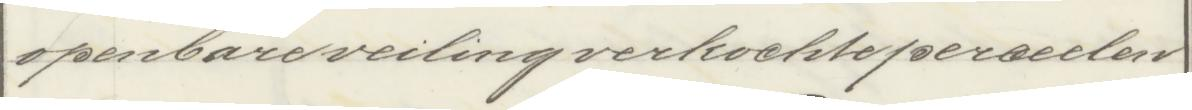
openbare veiling verkochte perceelen
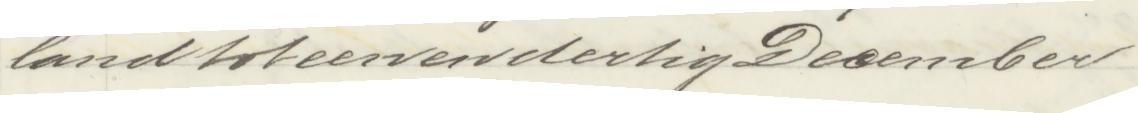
land tot een en dertig December
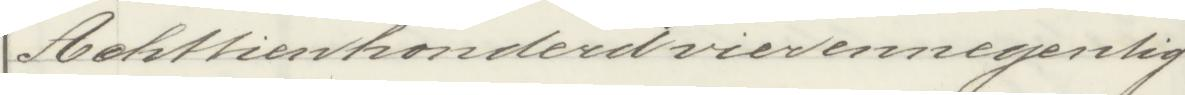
Achttien honderd vier ennegentig
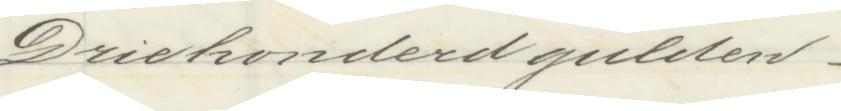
Driehonderd gulden
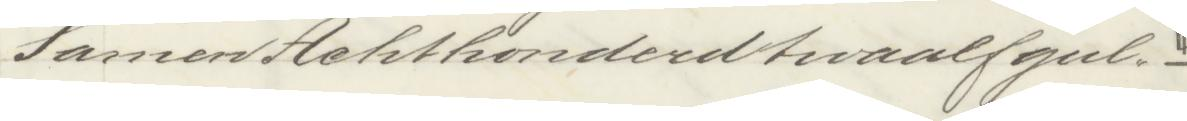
samen Achthonderd twaalf gul„
